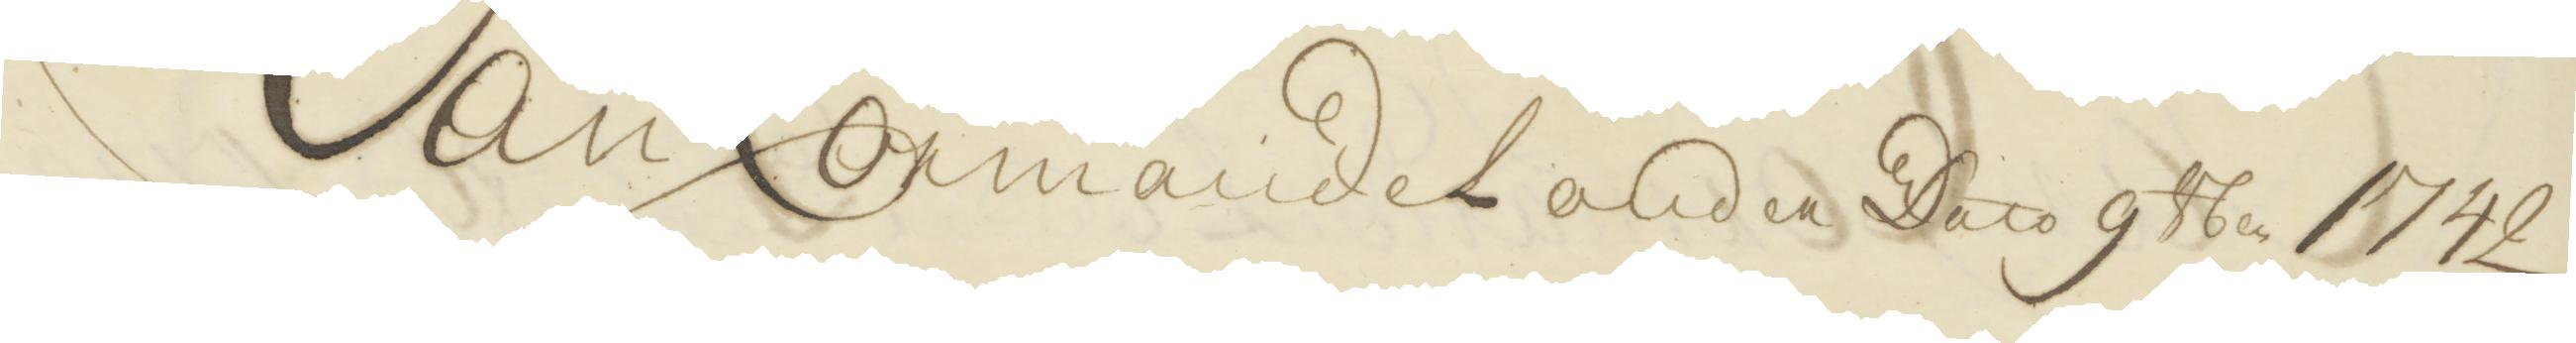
Van Cormandel onder Dato 9 8ber 1742
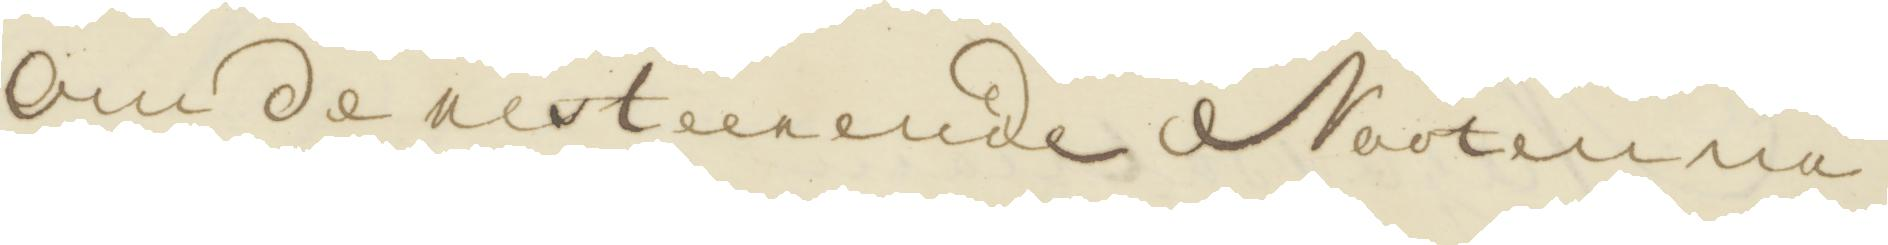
om de resteerende Nooten na
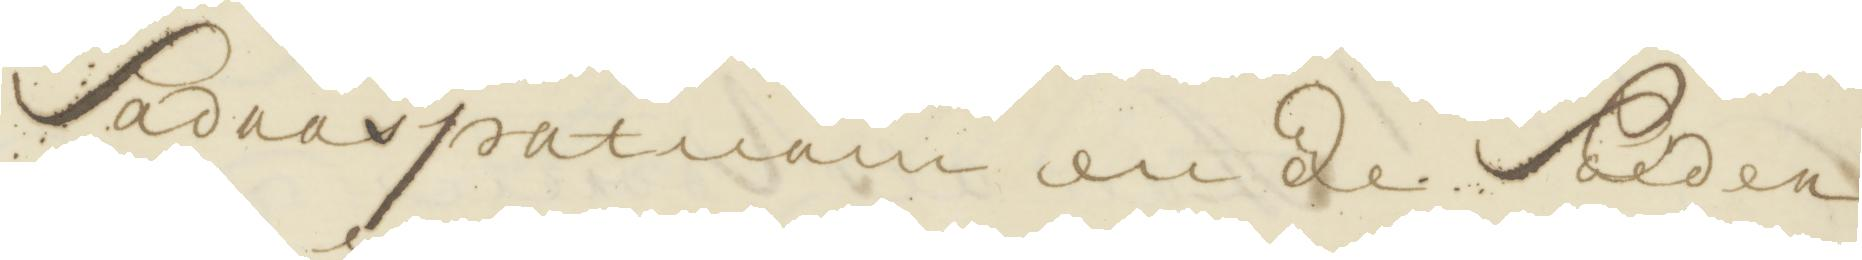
sadraspatnam en de poeder
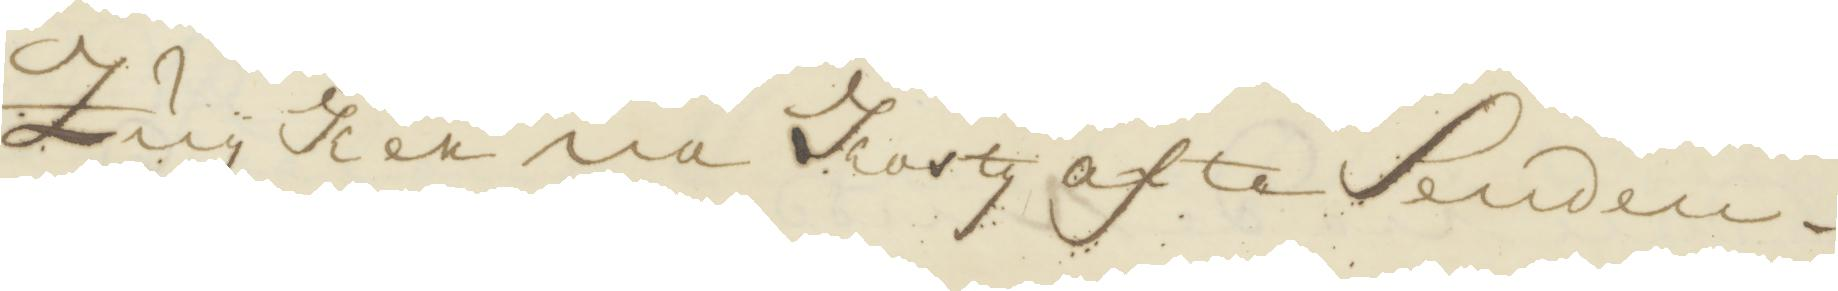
zuijker na kostij afte senden –
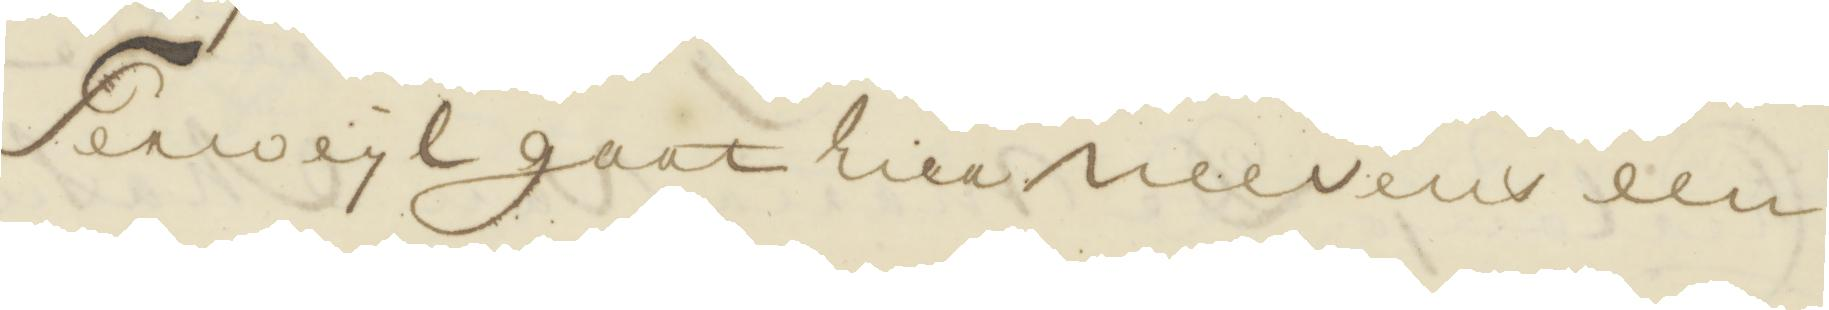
Terweijl gaat hier neevens een
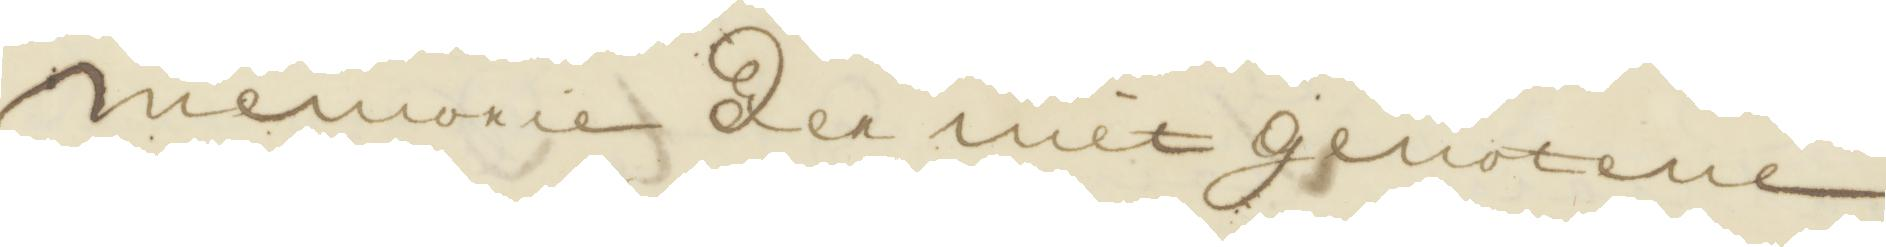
memorie der niet genotene
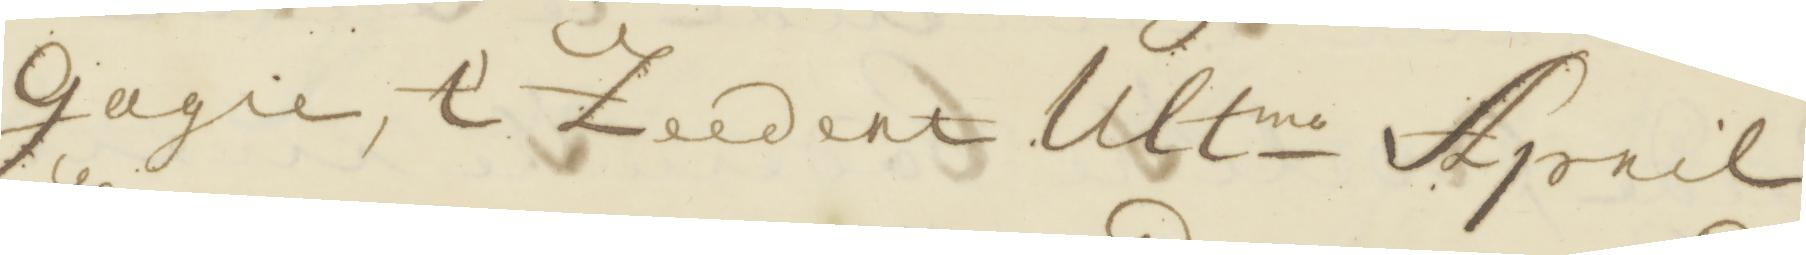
gagie, t' zeedert ult=mo April
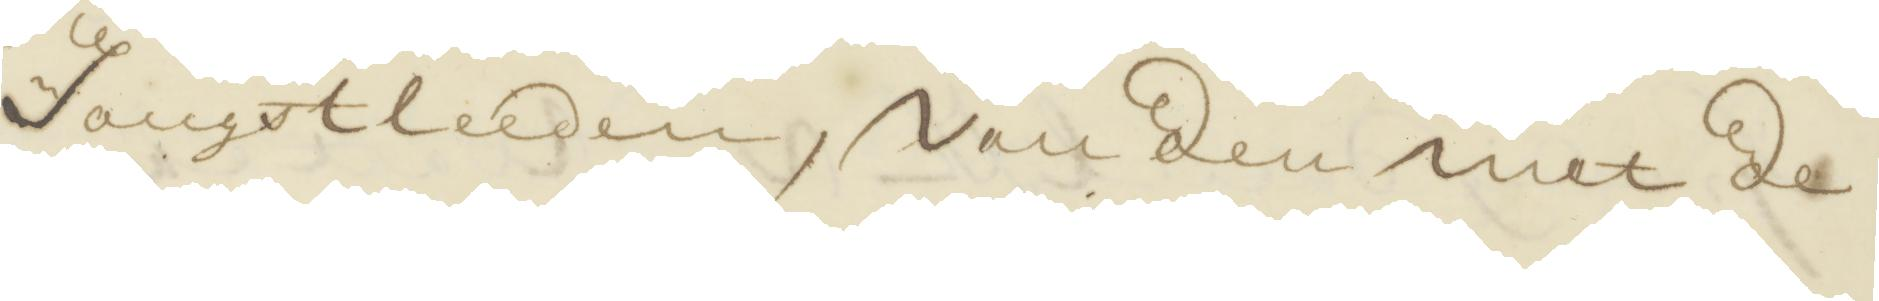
Iongstleeden, van den met de
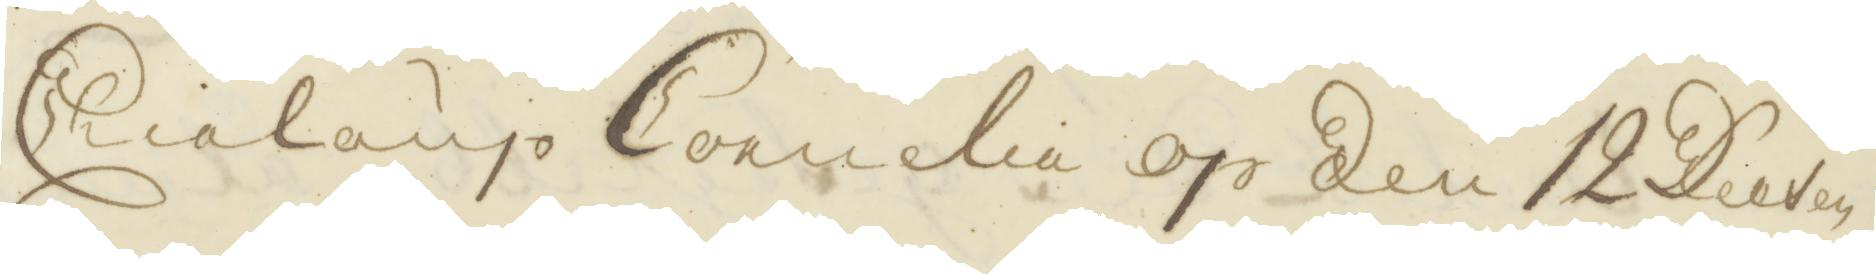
Chialoup Cornelia op den 12 Deesen
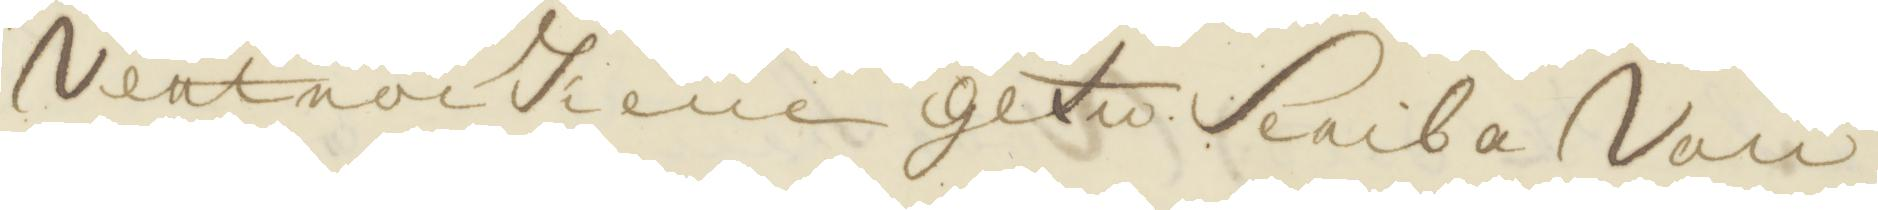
vertrockene gesw: scriba van
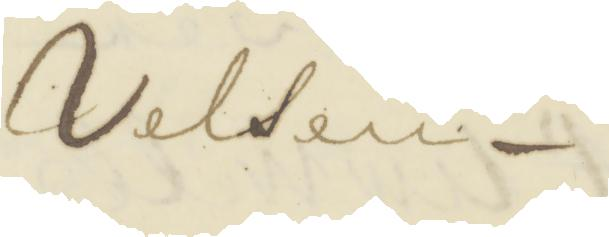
velsen —
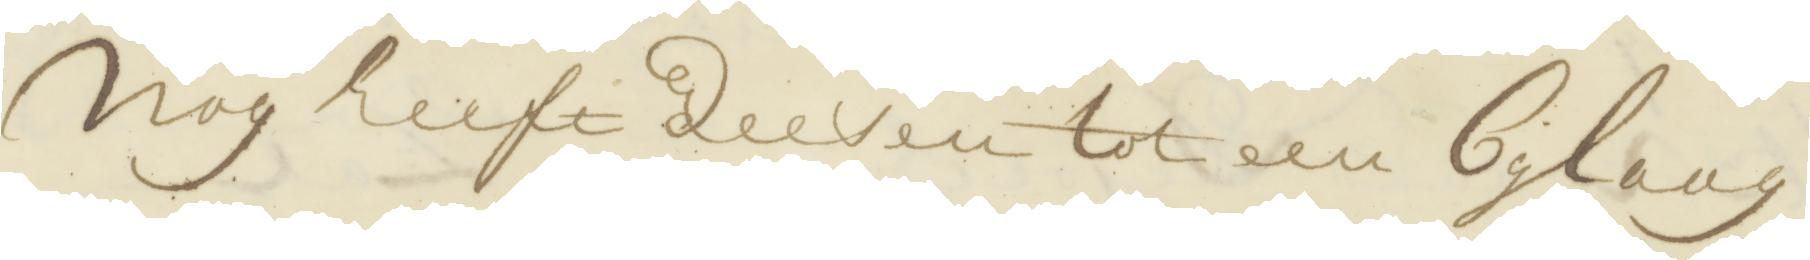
Nog heeft deesen tot een bijlaag
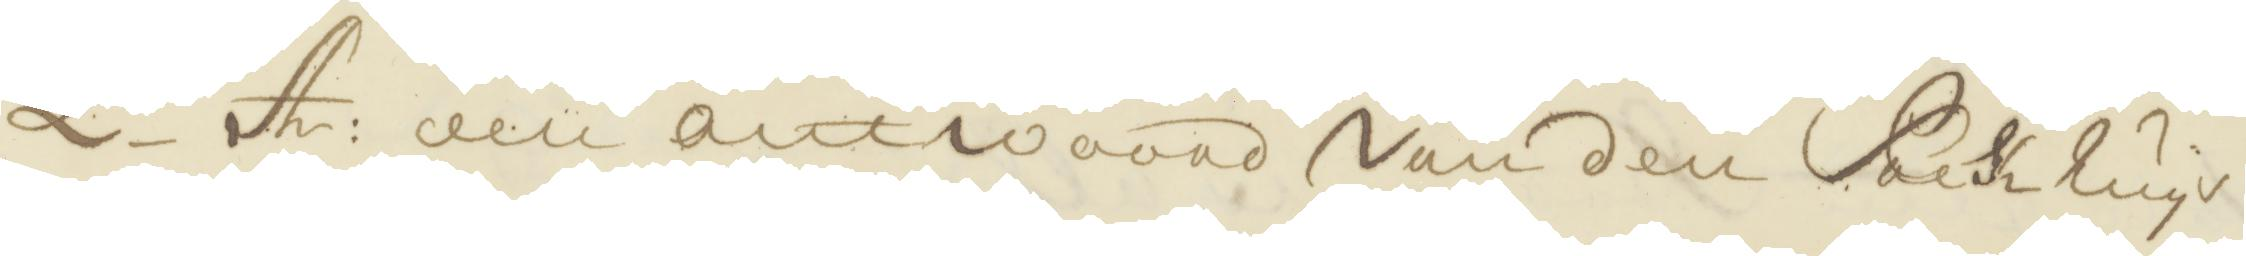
L_ra A: een antwoord van den Packhuijs
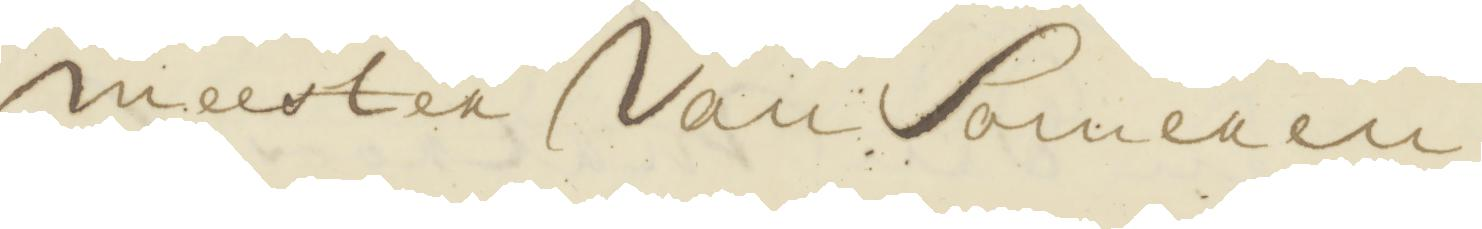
meester van someren
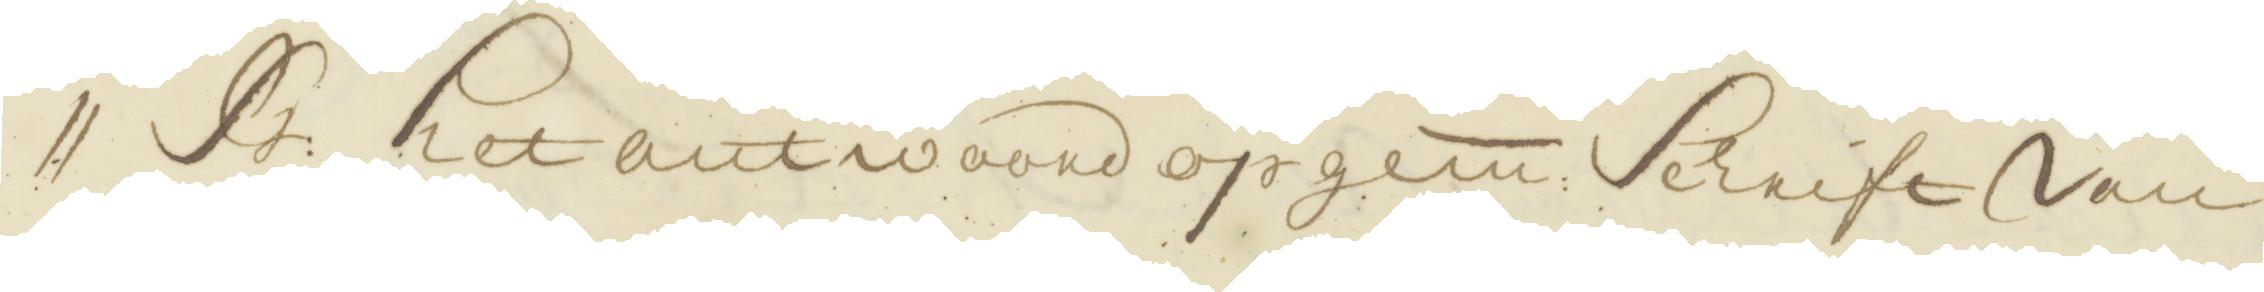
„ B: het antwoord op gem: schrift van
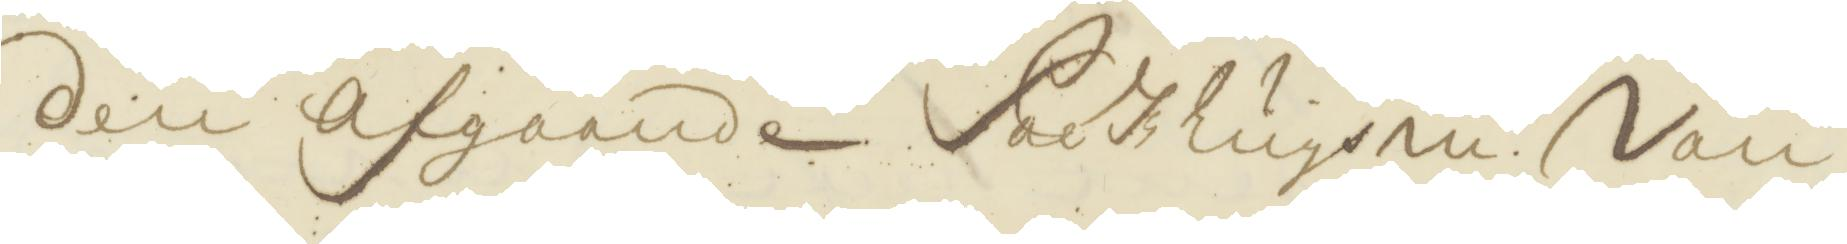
den afgaande Packhuijsm: van
